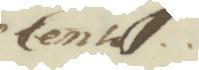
Cents .
